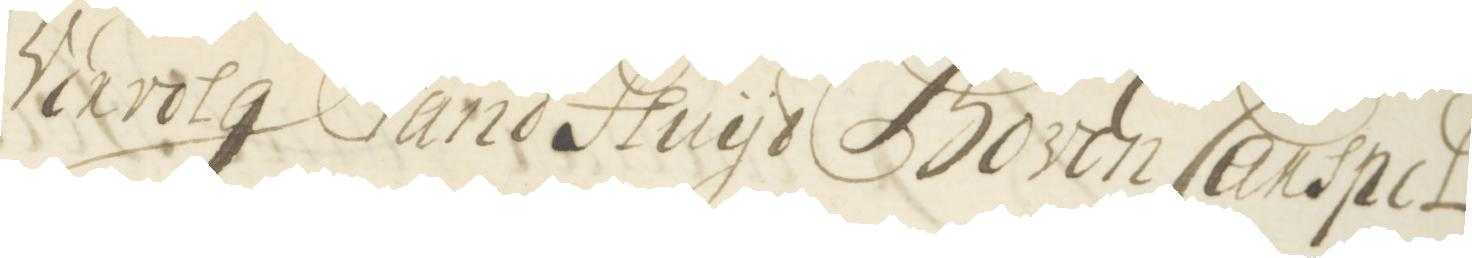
Vervolg Vand Huijs Boven Carspel
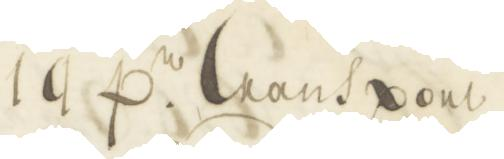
14 p.r transport
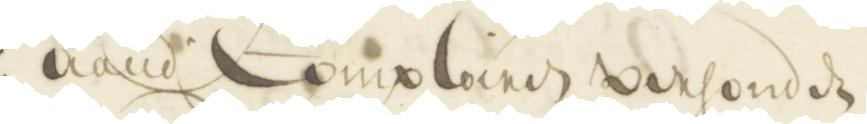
9 aand comptoiren versonden
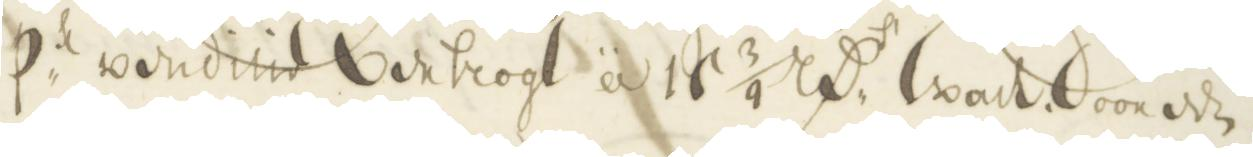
5 p„r vendilie verkogt ä 15¾ RE„s tvat. door een
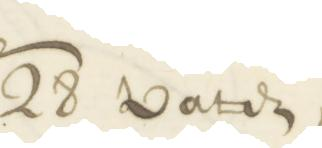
28 vaten
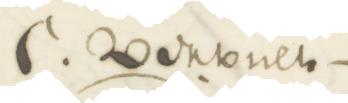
5. vervult
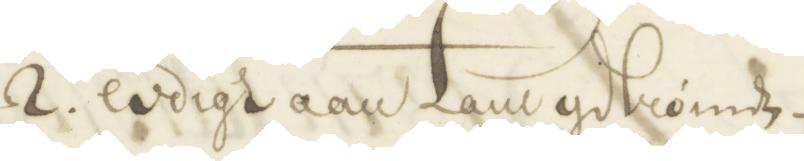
2. ledigh aan Lant gekomen
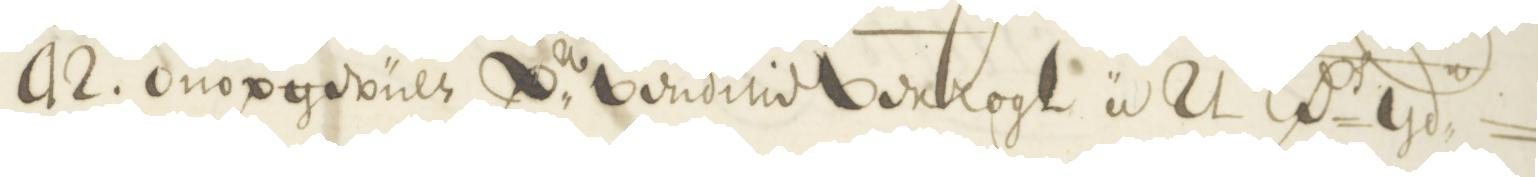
42. onopgevult p„r vendilie verkogt ä 21 RE=s tjd„r=
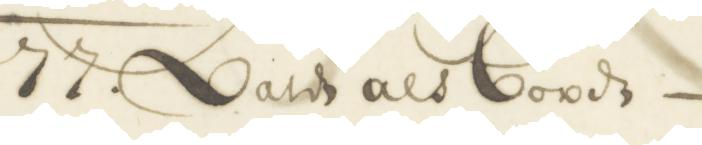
77. Vaten als boven
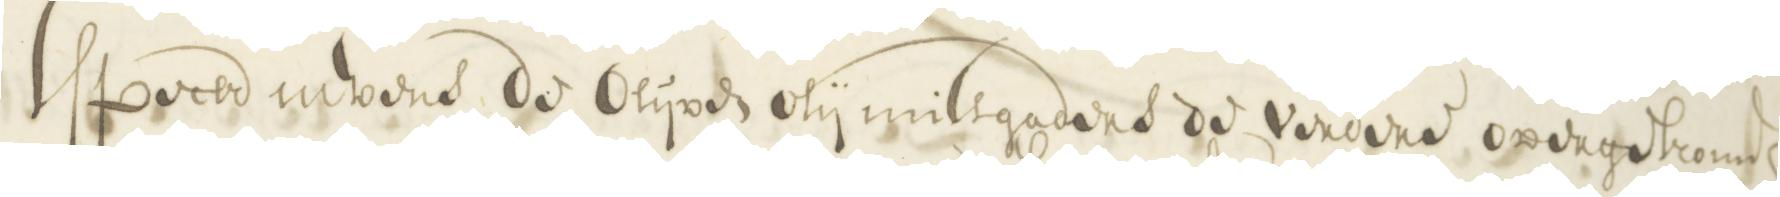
tspeck nevens de Olijven olij mitsgaders de verdere overgekome
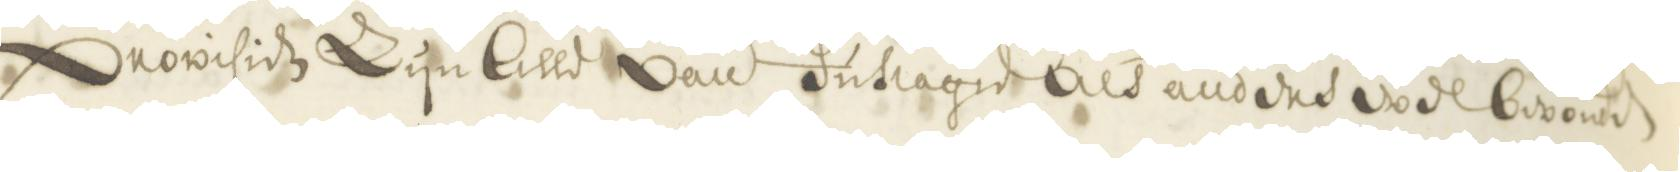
provisien zijn alle van Justagie als anders wel bevonden
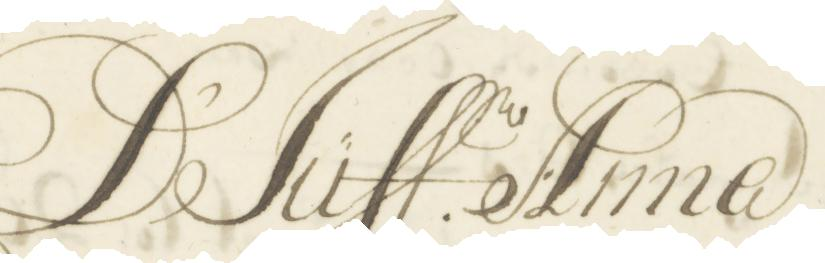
De Juff. Anna
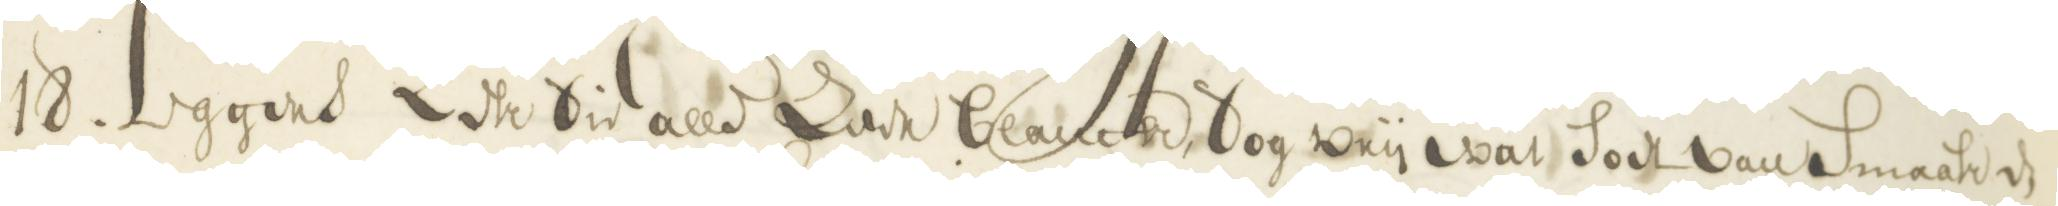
18. Leggers Lek die alle zeer blanck, dog vrij wat soet van Smaak en
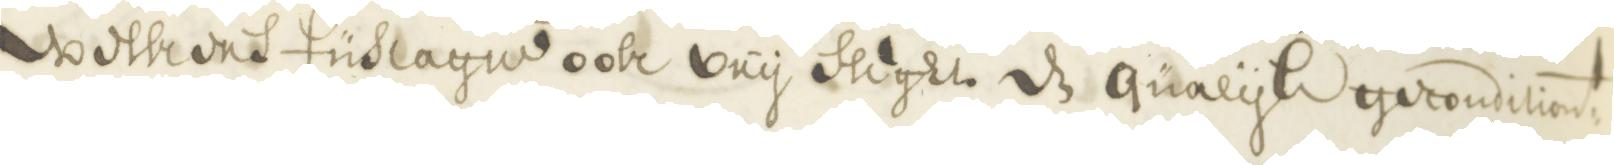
welkers fuslagie ook vrij sleght en qualijk gecondition:t
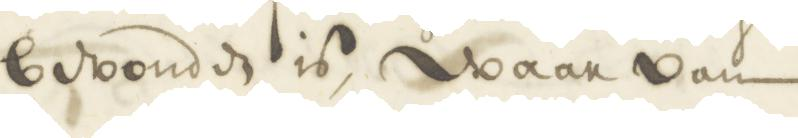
bevonden is, waar van
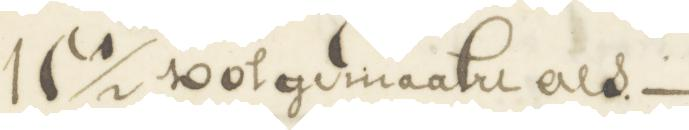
15½ volgemaakt als.-
